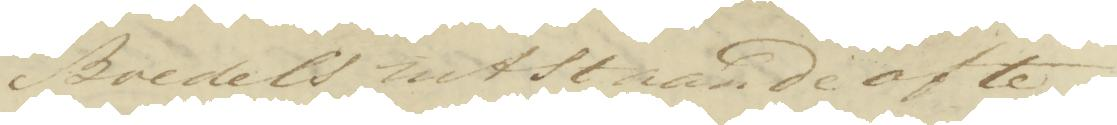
Boedels uitstaande of te
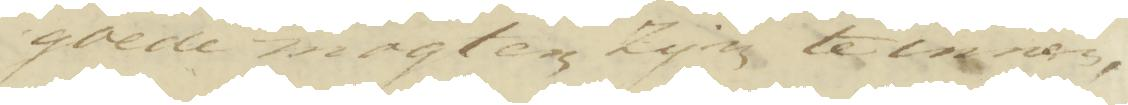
goede mogten zijn te in ver,
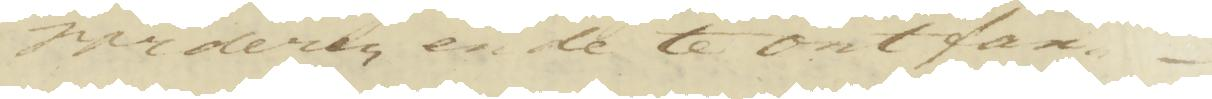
vorderen en de te ontfan.
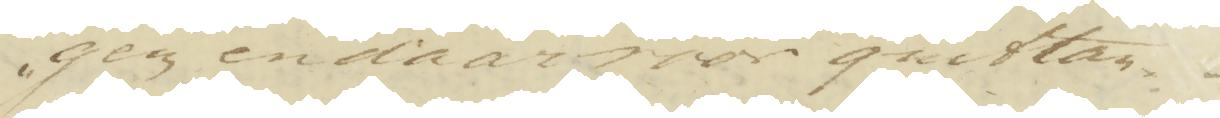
„gen en daarvoor quittan„
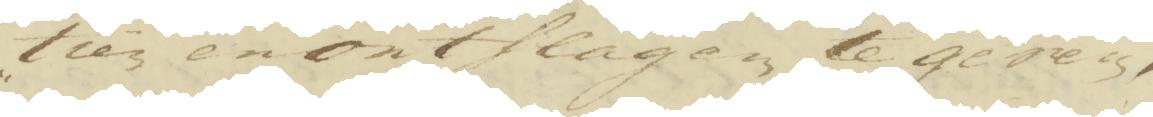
„tien en ontslagen te geven,
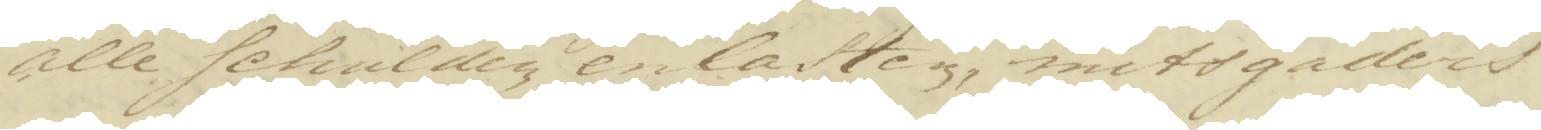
alle schulden en lasten, mitsgaders
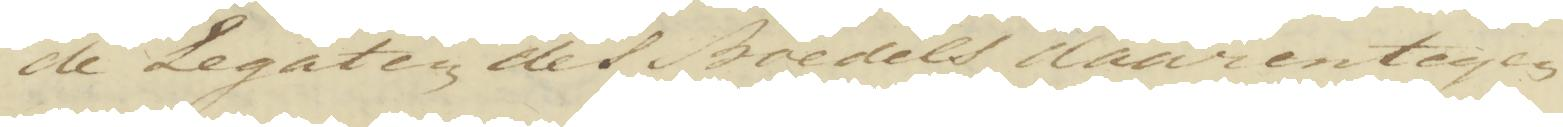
de Legaten des Boedels daarentegen
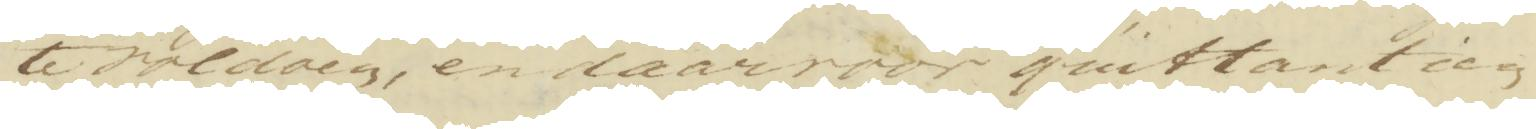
te voldoen, en daarvoor quittantien
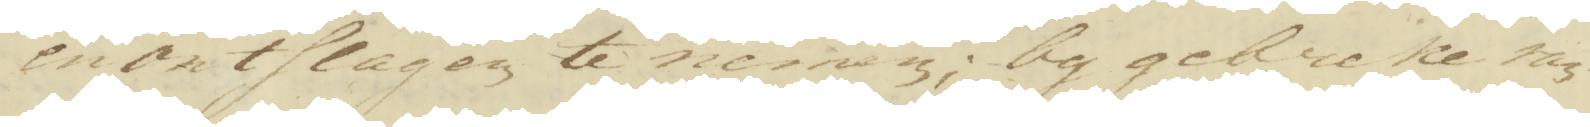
en ontslagen te nemen; bij gebreke van
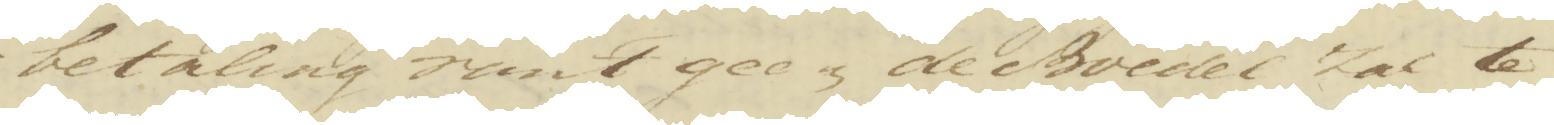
betaling van ’t geen de Boedel zal te
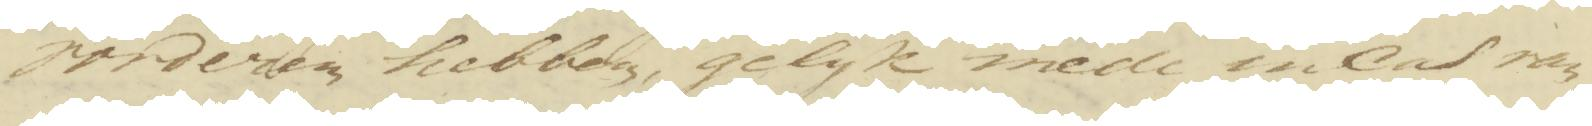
vorderen hebben, gelijk mede in cas van
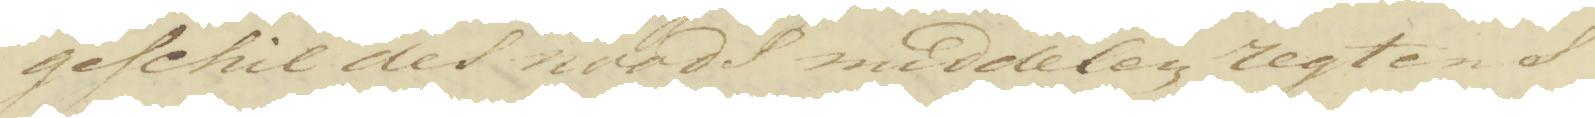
geschil des noods middelen regtens
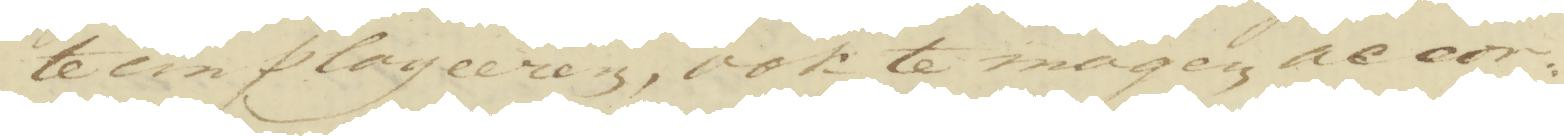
te employeeren, ook te mogen accor„
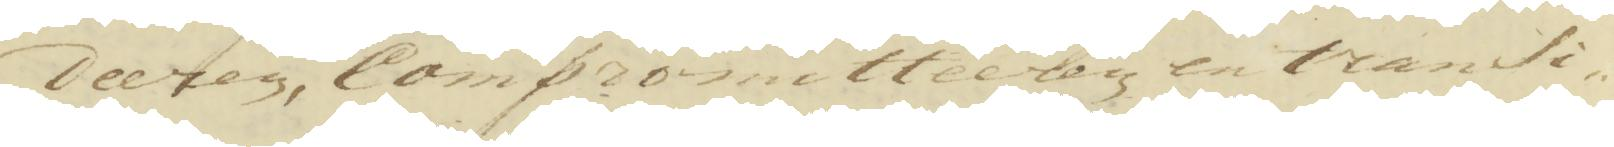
deeren, Compromitteeren en transi„
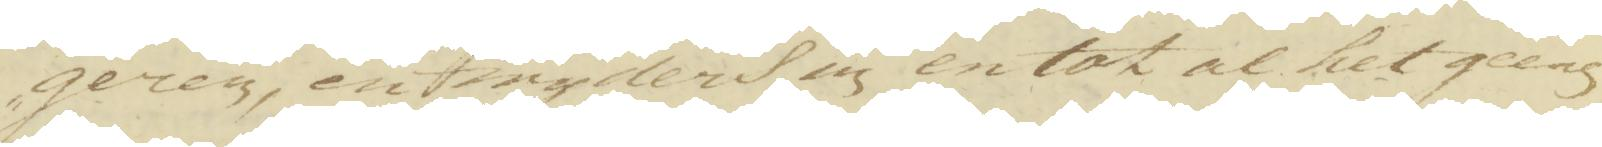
„geren, en wyders in en tot al het geene
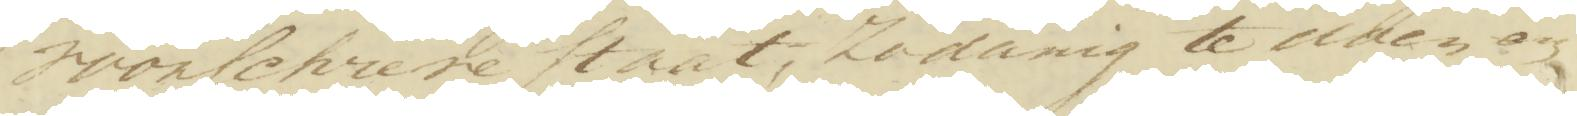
voorschreve staat, zodanig te doen en
